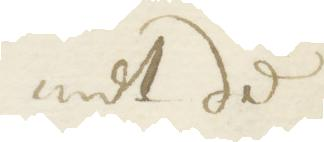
met de
